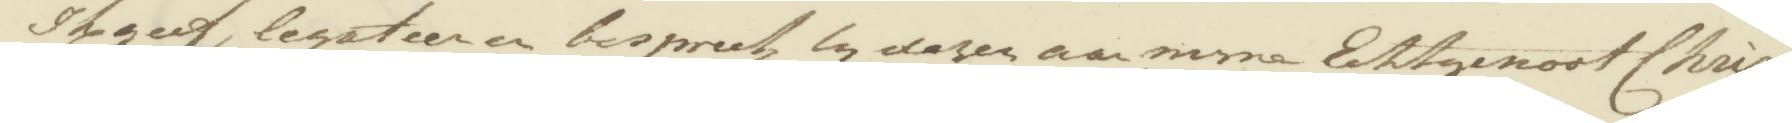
Ik geef, legateer en bespreek by dezen aan myne Echtgenoot Chris
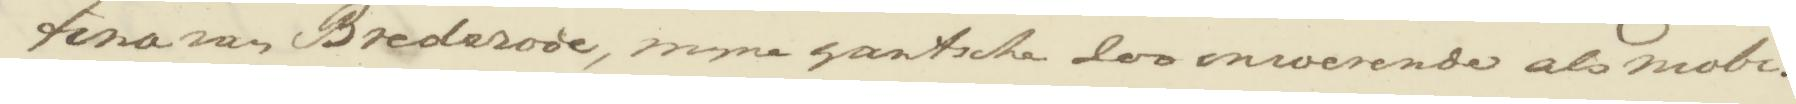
tina van Brederode, myne gantsche zoo onroerende als mobi„
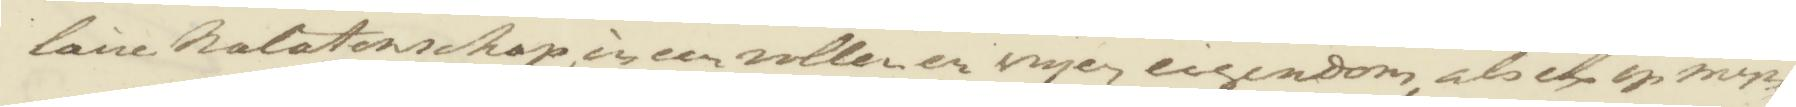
laire nalatenschap, in een vollen en vryen eigendom, als ik op myn
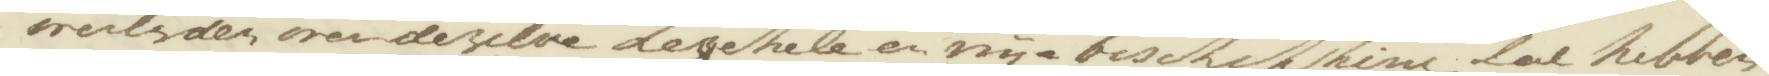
overlyden over dezelve de gehele in mijn beschikking zal hebben,
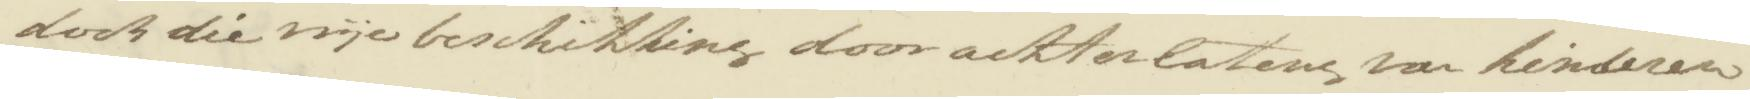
doch die vrije beschikking door achterlatenen van kinderen
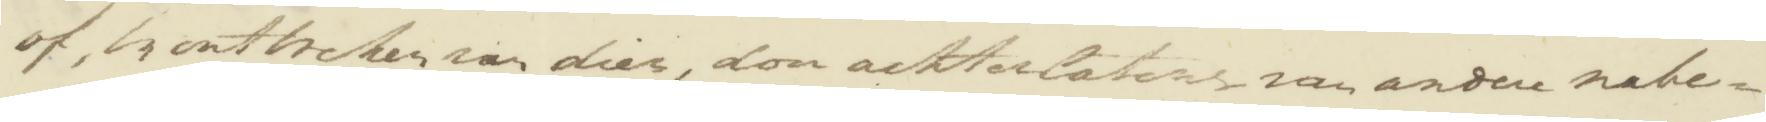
of, by ontbreken van dien, zou achterlatene van andere nabe„
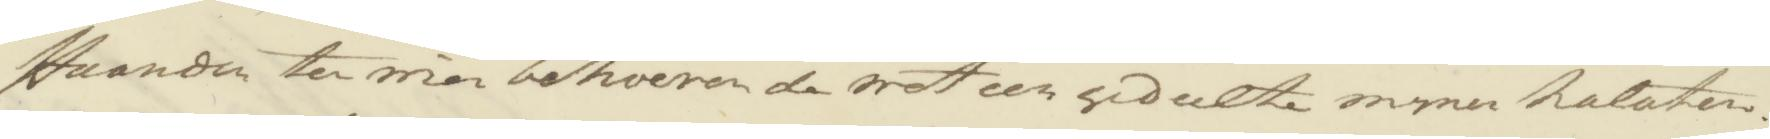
staanden ter wier behoeven de wet een gedeelte myner nalaten
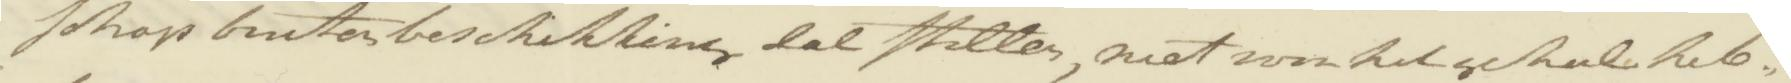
schap buiten beschikking zal stellen, niet voor het geheel heb„
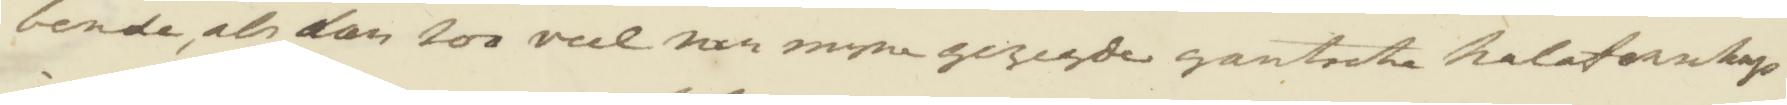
bende, als dan zoo veel ven myne gezegde gantsche nalatenschap
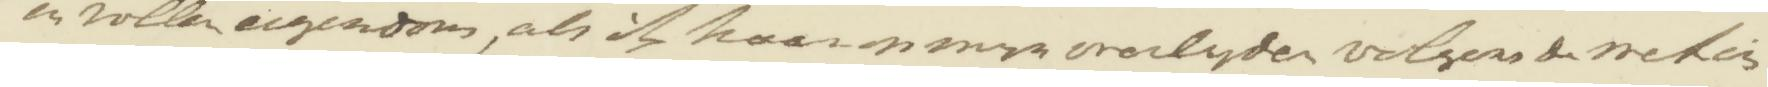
in vollen eigendom, als ik haar op myn overlyden volgens de wet in
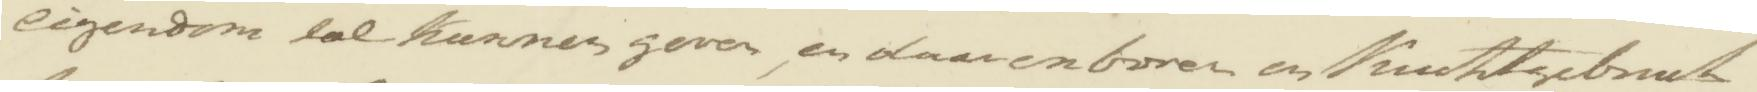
eigendom zal kunnen geven en daar en boven en vruchtgebruik
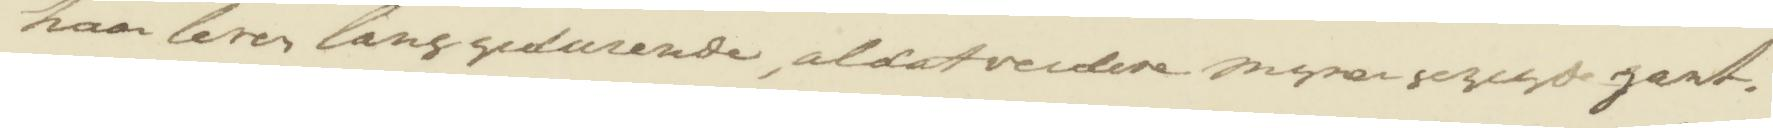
haar leven lang gedurende, al dat verdere mijner gezegde gant,
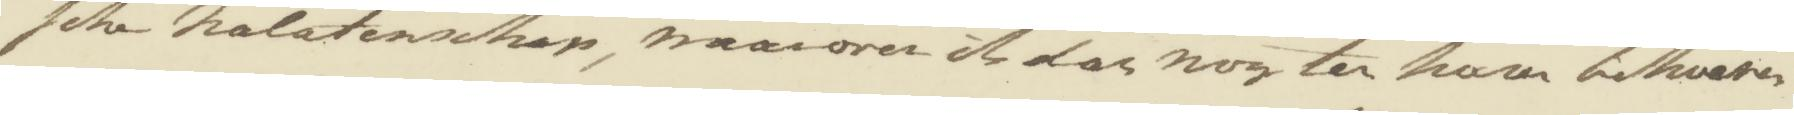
sche nalatenschap, waarover ik dan nog ter haren behoeven
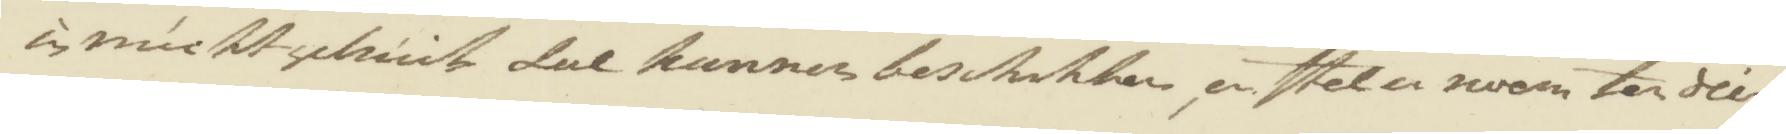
in vruchtgebuik zal kunnen beschikken, en stel en noem ter dien
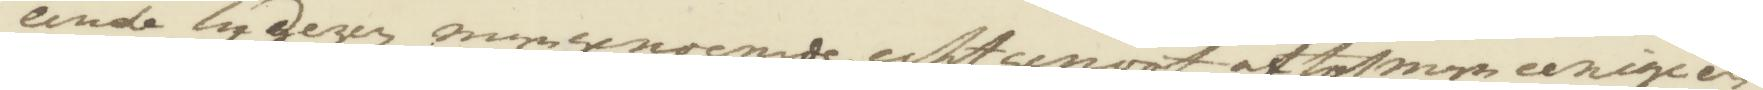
einde by dezen myn genoemde echtgenoot af tot myn eenige en
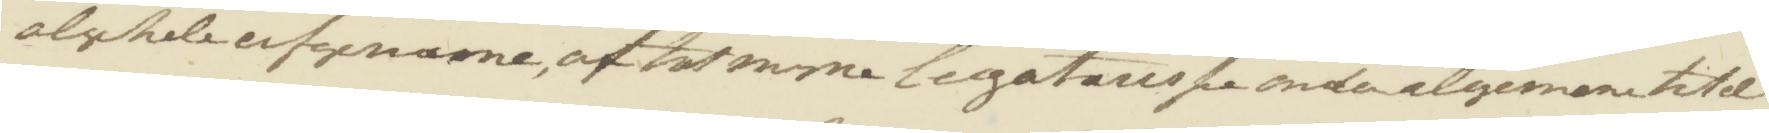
algehele erfgename, af tot myne legatarisse onder algemeen titel
